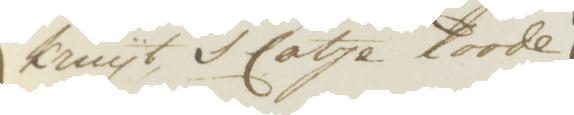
kruijt, 1 Catje loode
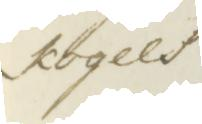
kogels
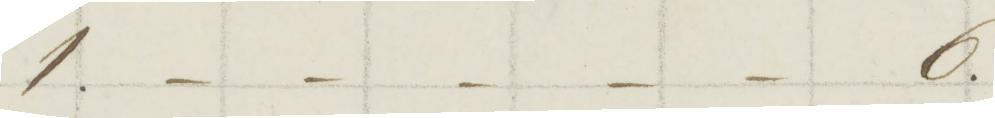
1. - - - - - 6.
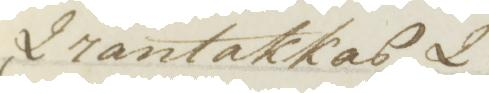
2 rantakkas 2
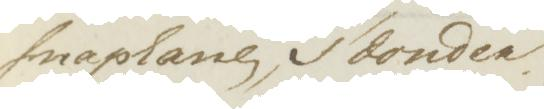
snaphanen, 1 donder„
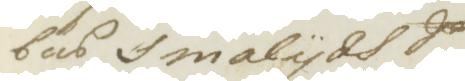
bus, 1 malijds do
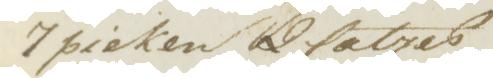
7 pieken, 2 Catjes
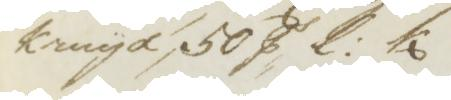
kruijd, 50 p„s l: k
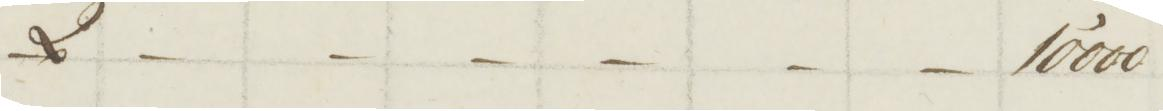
- 2 - - - - - - 10000
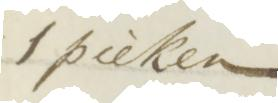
1 pieken
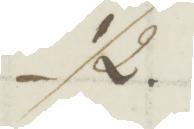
- ½.
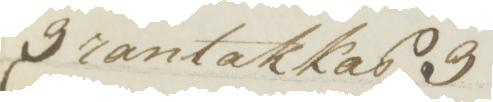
3 rantakkas, 3
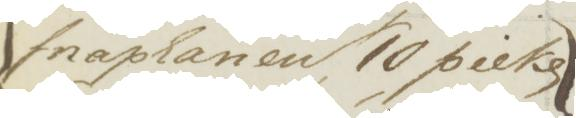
snaphanen, 10 pieken
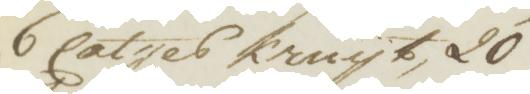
6 Catjes kruijt, 20
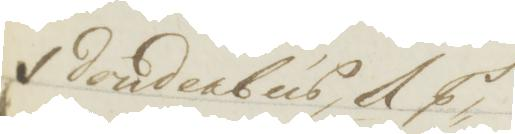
1 donderbus, 4 p„s
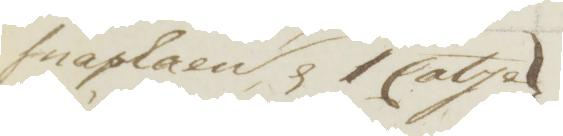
snaphaen, en 1 Catje
